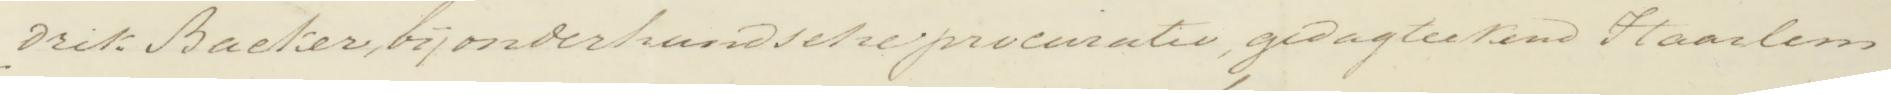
drik Backer, bij onderhandsche procuratie, gedagteekend Haarlem
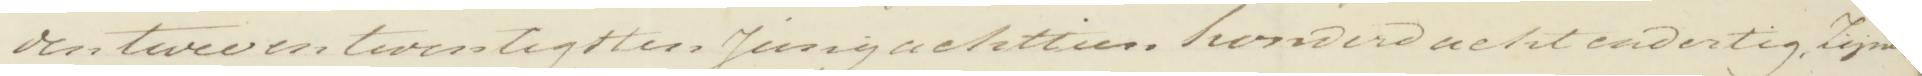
den twee en twintigsten Junij achttien honderd acht endertig, zijnde
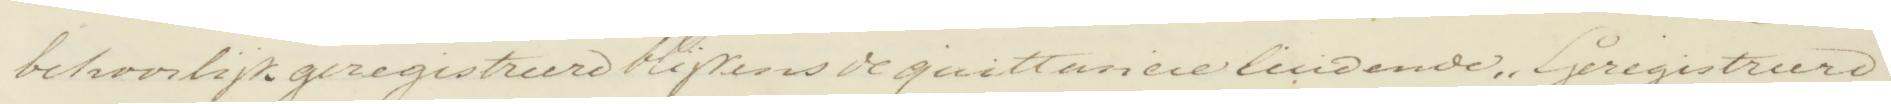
behoorlijk geregistreerd bijkens de quittancie luidende ,,Geregistreerd
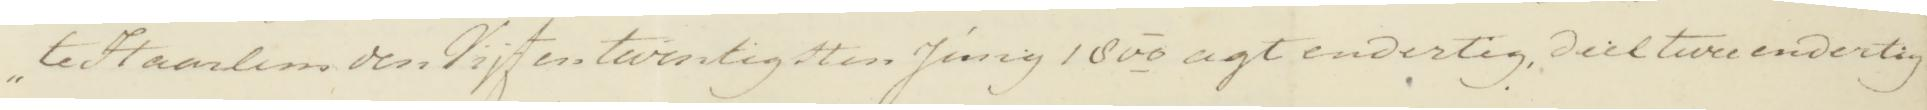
„te Haarlem den Vijf en twintigsten Junij 1800 agt endertig, deel twee endertig
